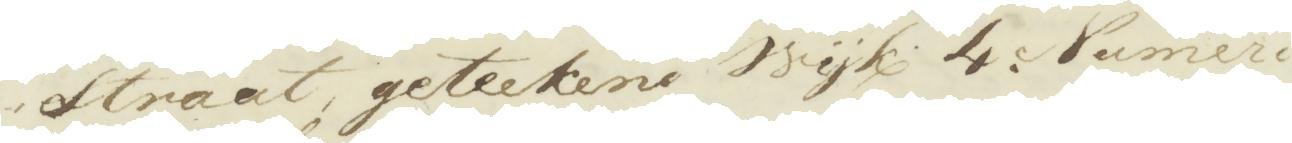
„straat, geteekend Wijk 4. Numero
